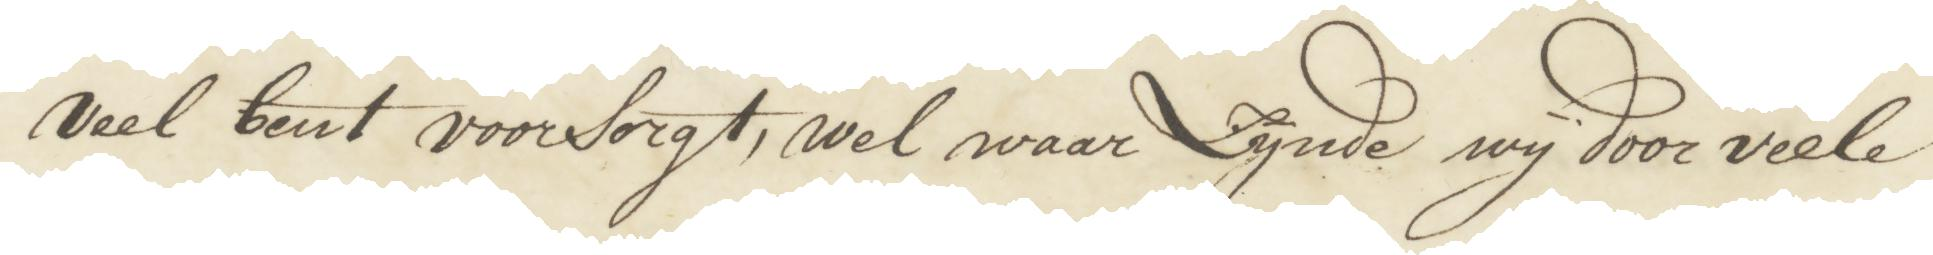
veel bent voorsorgt, wel waar zijnde wij door veele
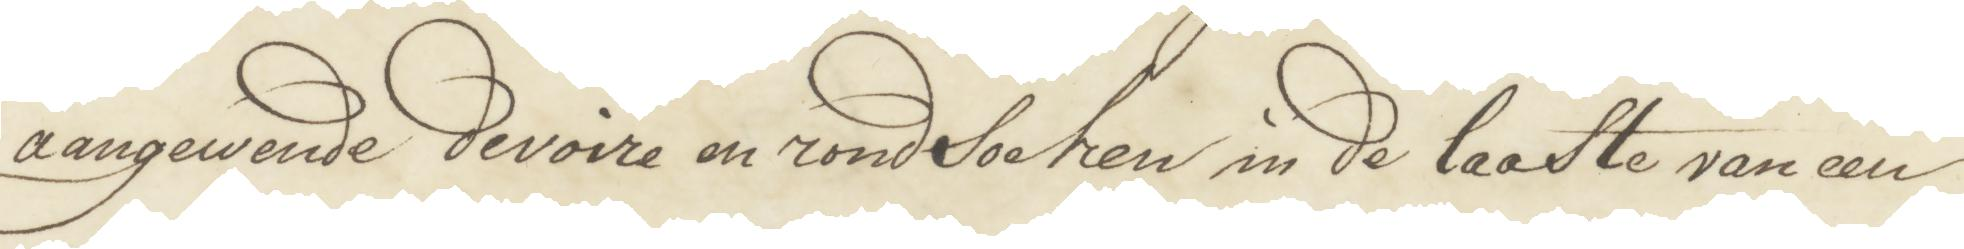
aangewende devoire en rondsoeken in de laaste van een
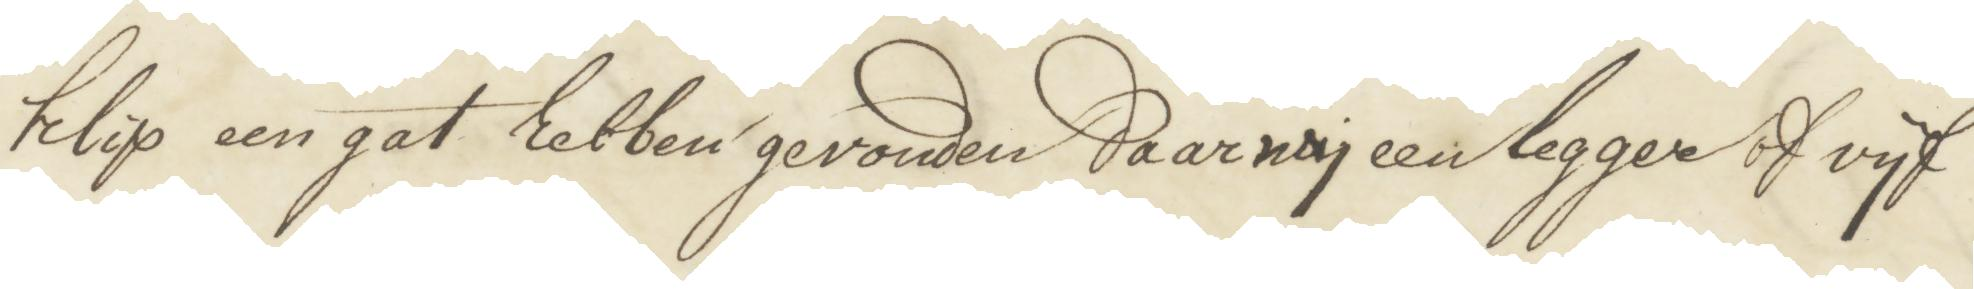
klip een gat hebben gevonden daar wij een legger of vijf
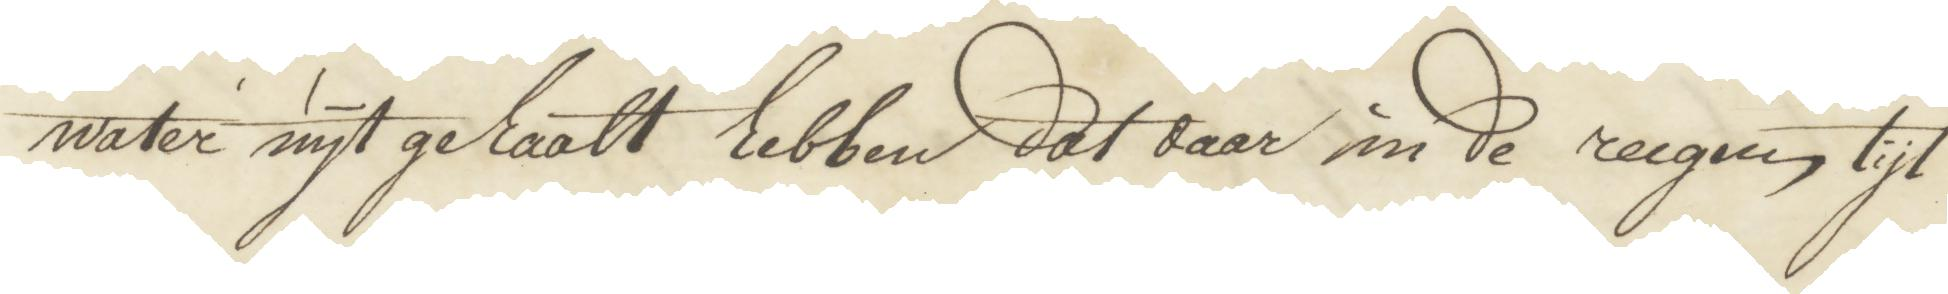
water uijt gehaalt hebben dat daar in de reegen tijt
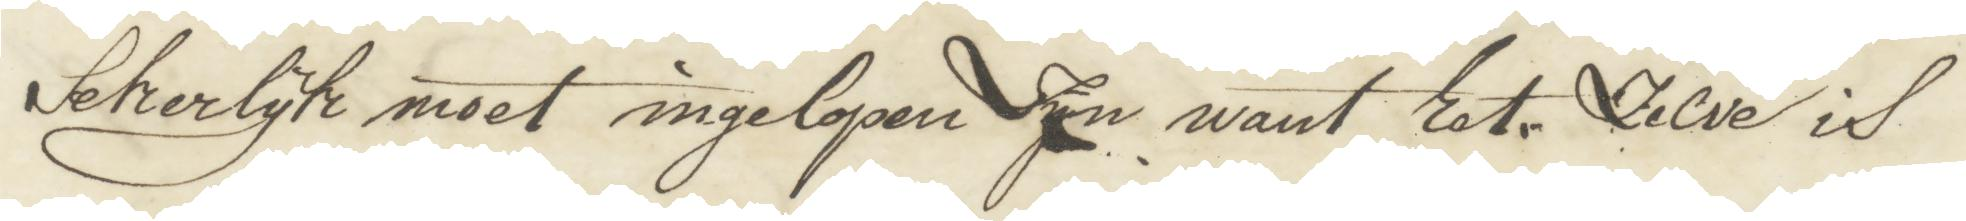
sekerlijk moet ingelopen zijn want het zelve is
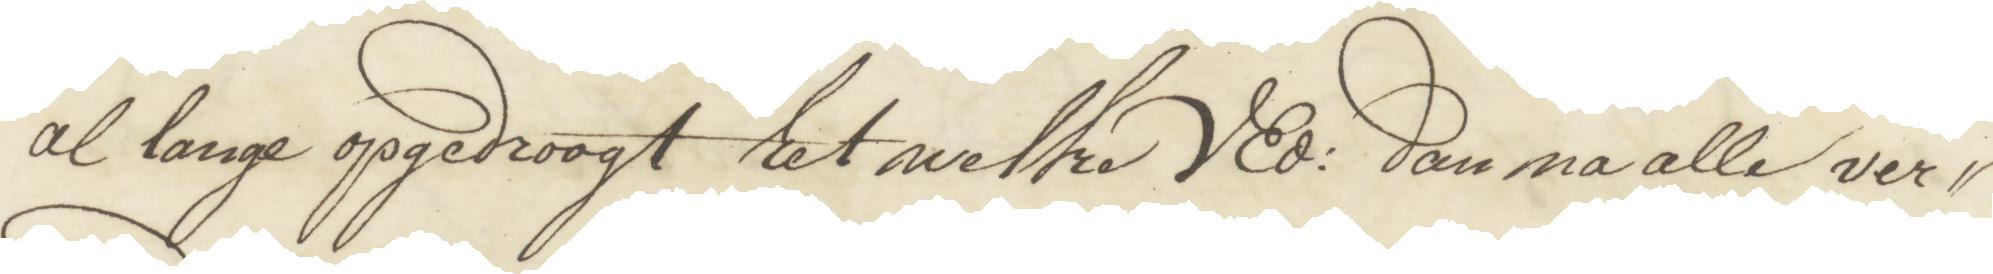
al lange opgedroogt het welke VEd: dan na alle ver„
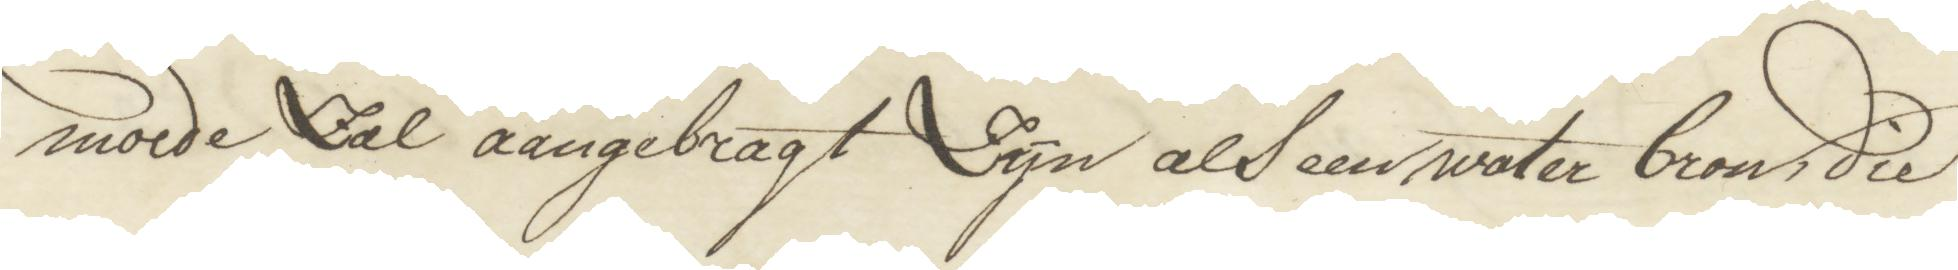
moede zal aangebragt zijn als een water bron, die
